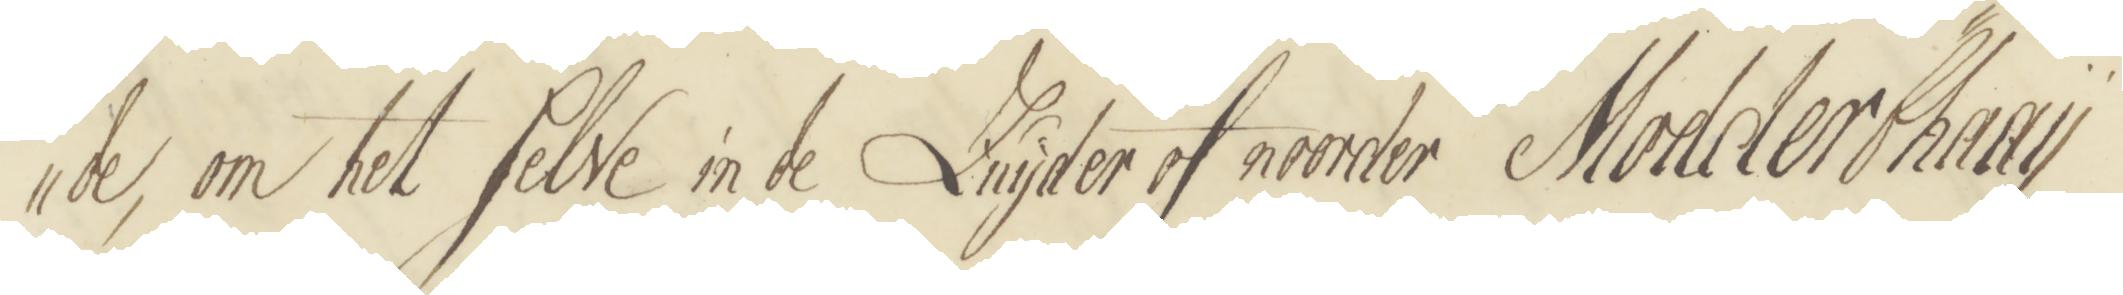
„de, om het selve in de zuijder of noorder Modderbhaaij
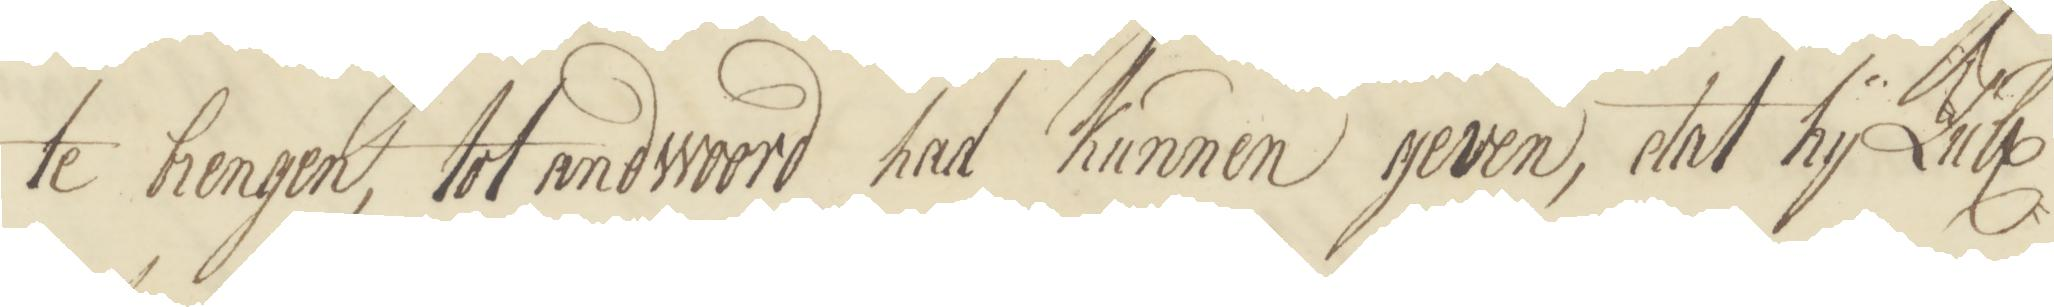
te brengen, tot andwoord had kunnen geven, dat hij zulx
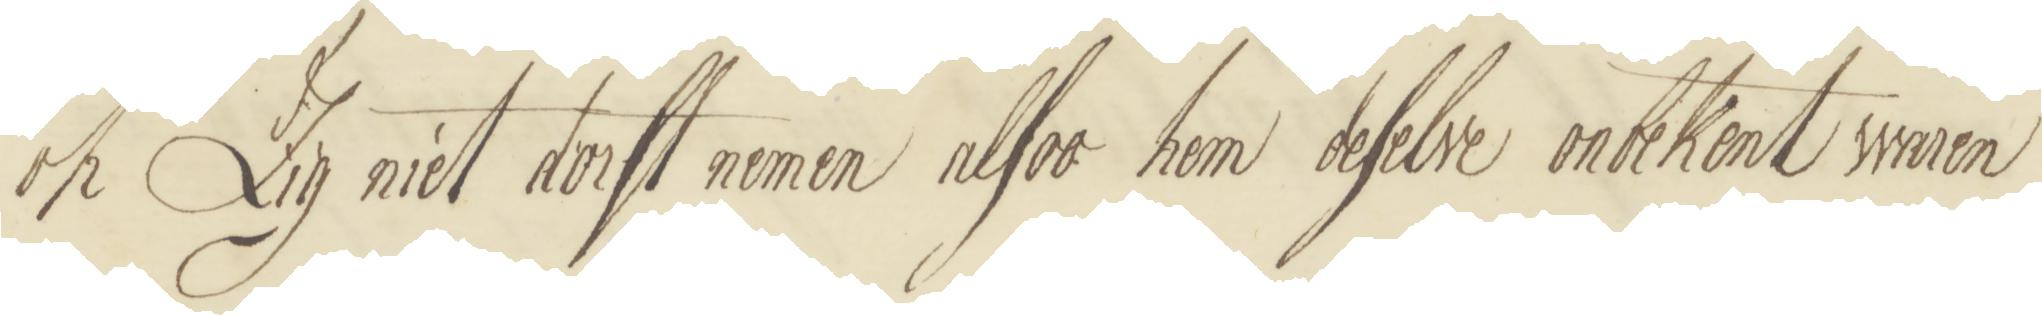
op zig niet dorst nemen alsoo hem deselve onbekent waren
